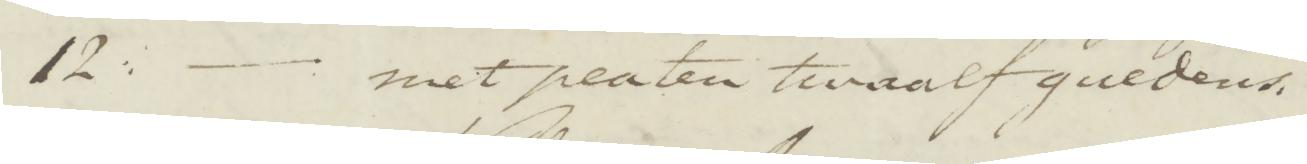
12: — met platen twaalf guldens.
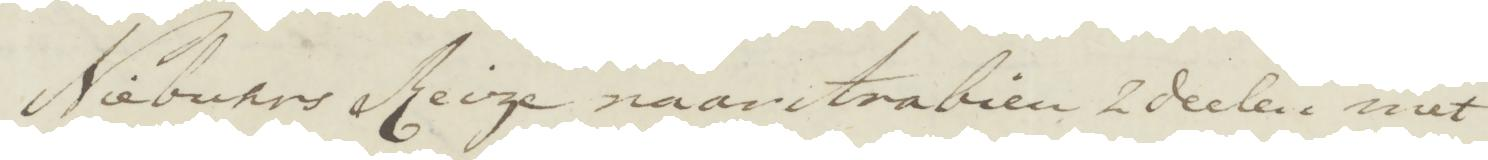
Niebuhrs Reize naar Arabien 2 deelen met
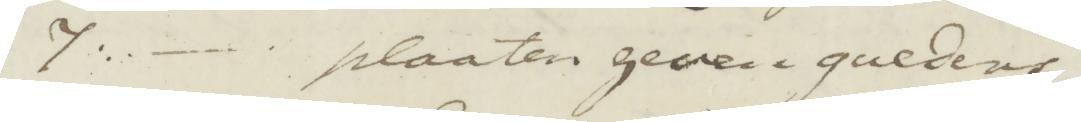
7: — plaaten zeven guldens.
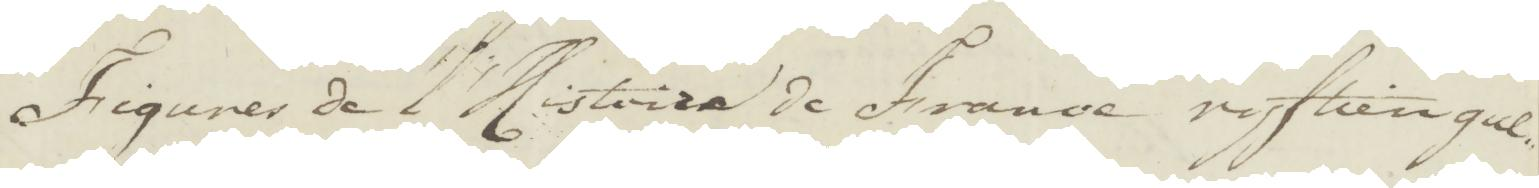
Figures de t' Histoire de France vyftien gul„
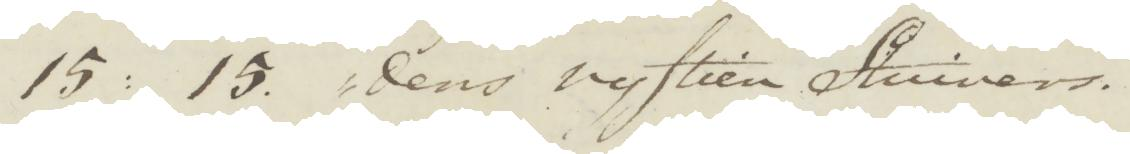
15:15. „dens vyftien Stuivers.
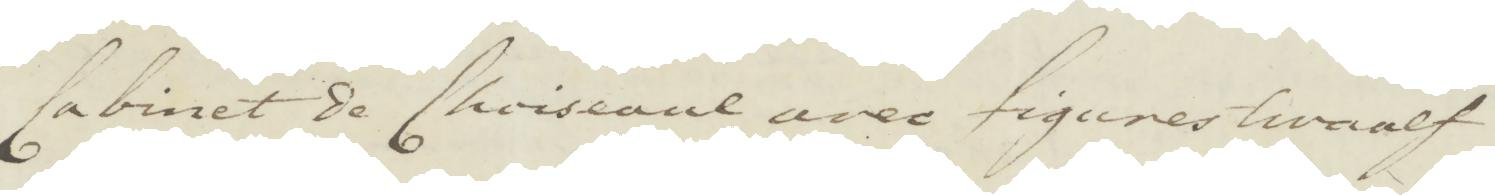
Cabinet de Choiseaul avec figures twaalf
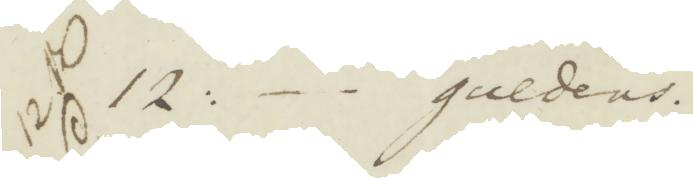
12: — guldens.
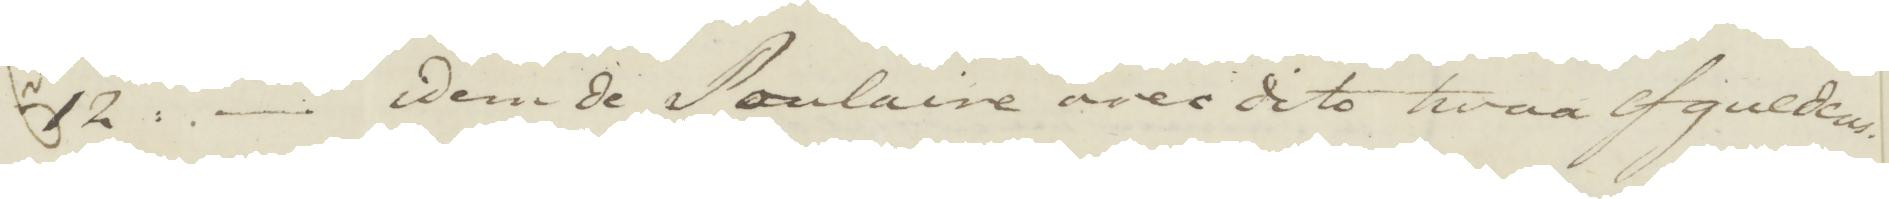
12: — idem de Poulaire avec dito twaalf guldens.
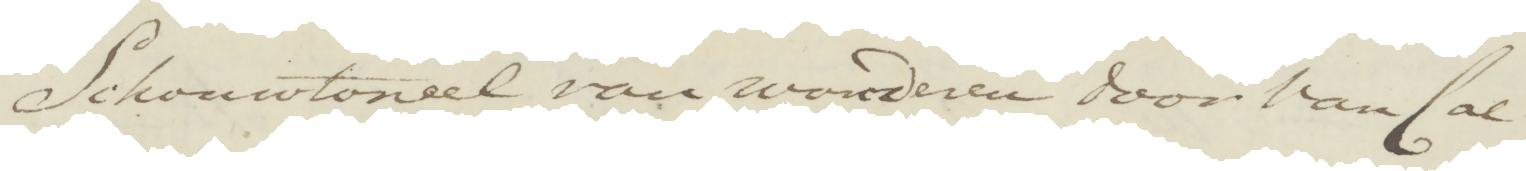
Schouwtoneel van wonderen door van Cal
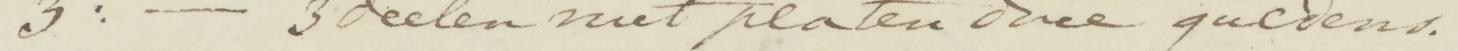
3: — 3 deelen met platen drie guldens.
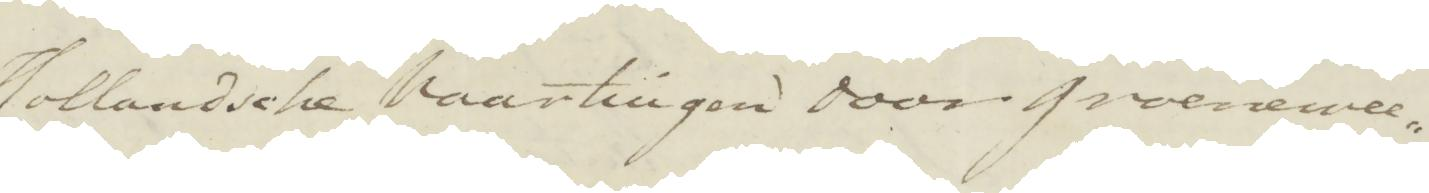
Hollandsche vaartuigen door groenewee„
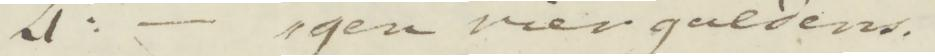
4: „gen vier guldens.
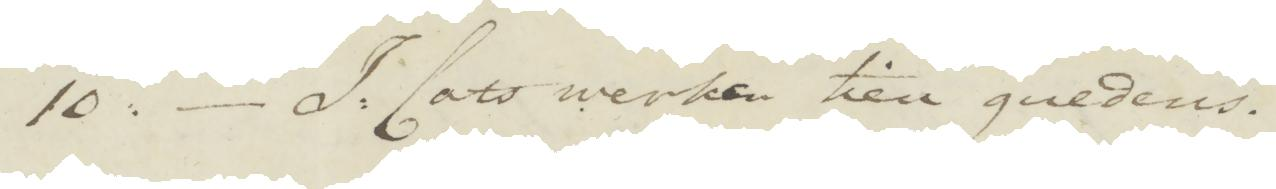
10: — J: Cats werken tien guldens.
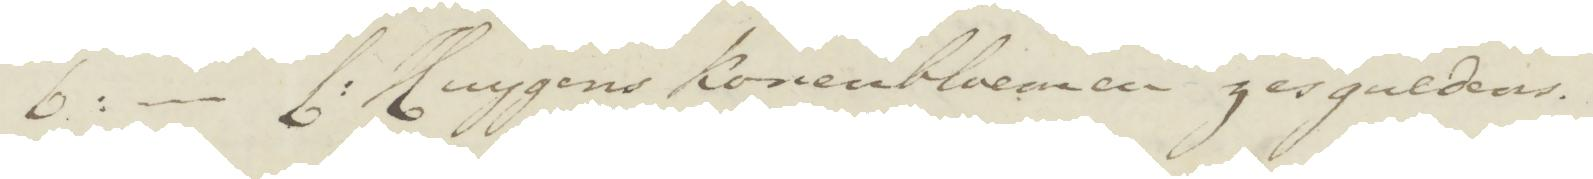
6: — C: Huygens korenbloemen zes guldens.
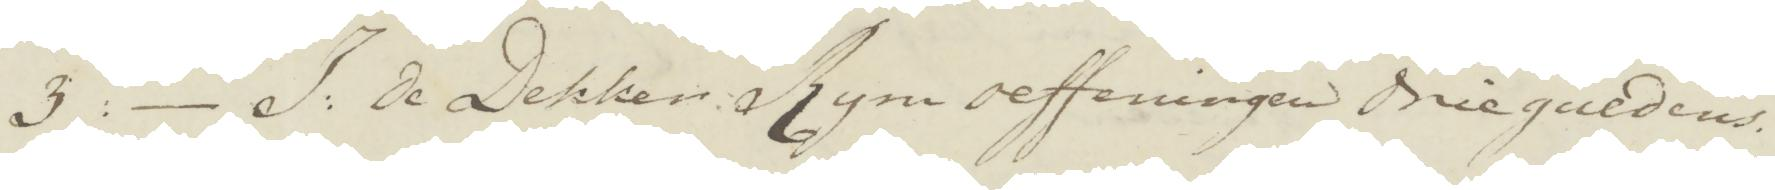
3: —: J: de Dekker Rym oeffeningen drie guldens.
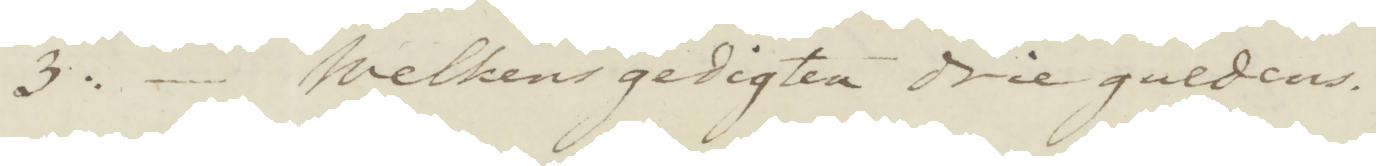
3: — welkens gedigten die guldens.
